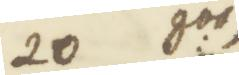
20 d:os
